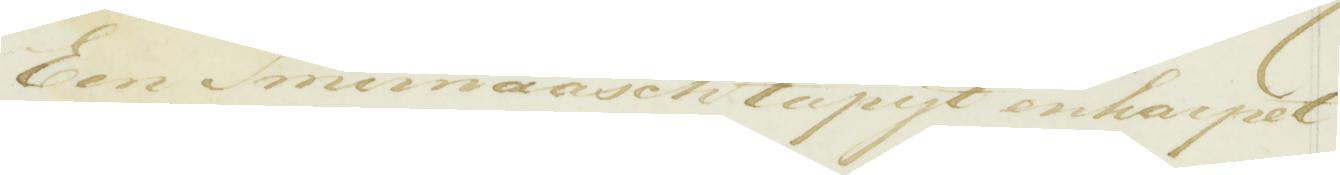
Een Smirnaasch tapijt en karpet
